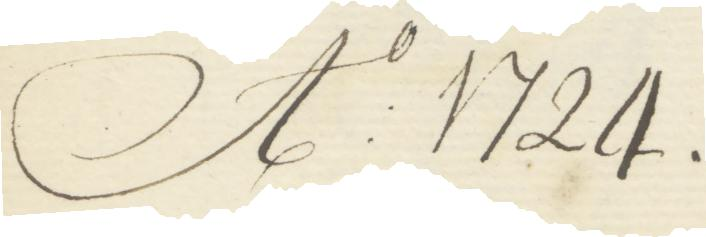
A:o 1724.
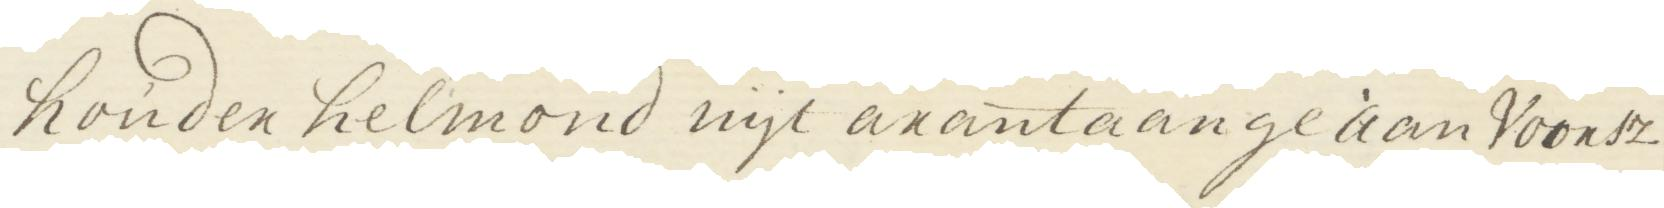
houder helmond uijt arantaange aan voorsz
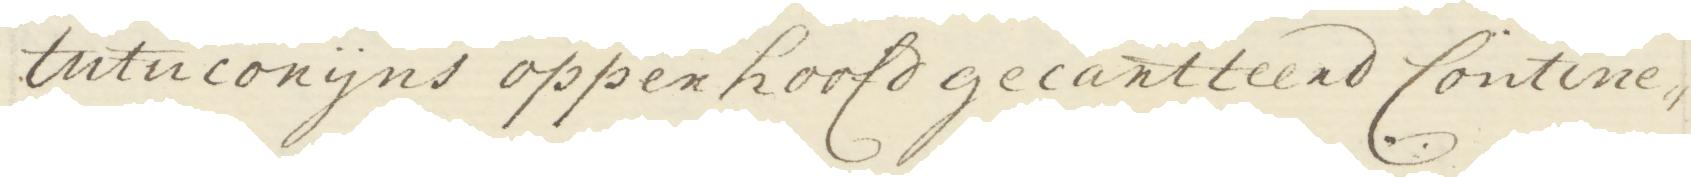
tutucorijns opperhoofd gecartteerd Contine„
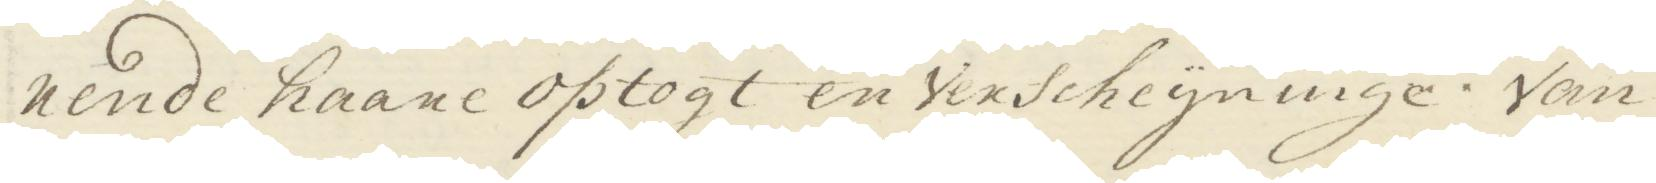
rende haare optogt en verscheijninge van
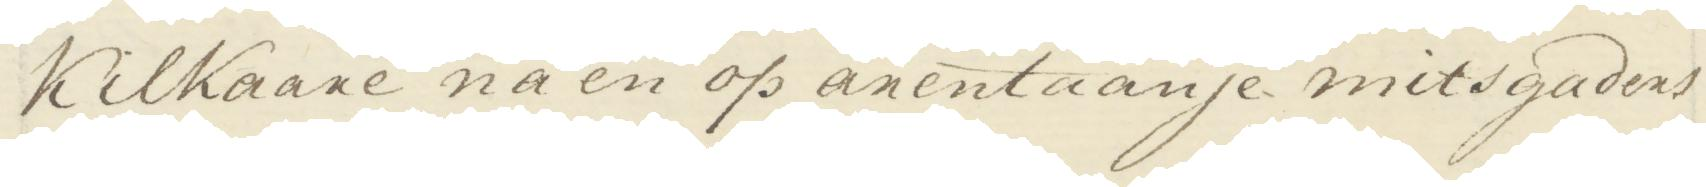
Kilkaare na en op arentaanje mitsgaders
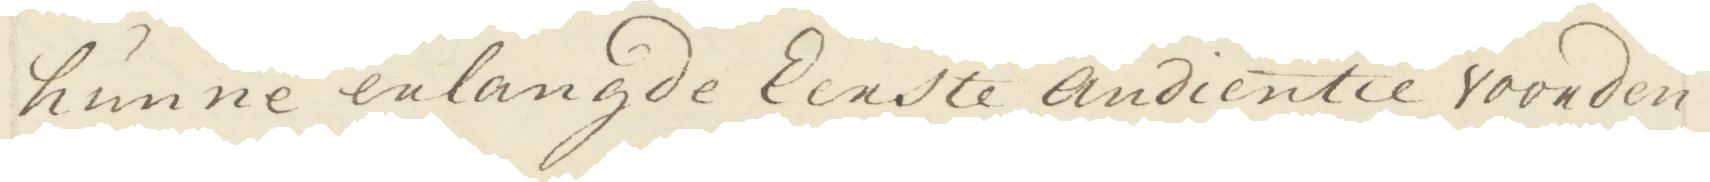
hunne erlangde Eerste audientie voor den
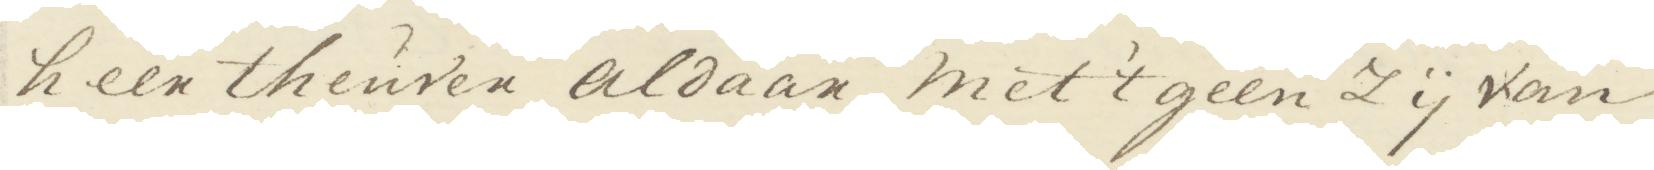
heer theuver aldaar, met ’t geen zij van
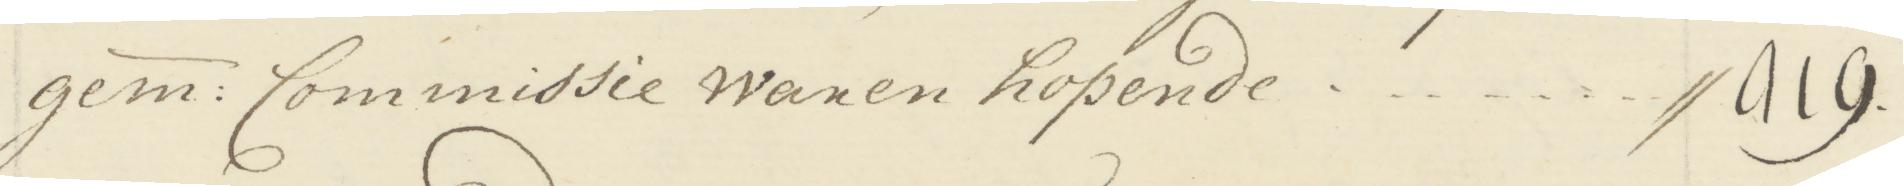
gem: Commissie waren hopende - - - - - - - - „419.
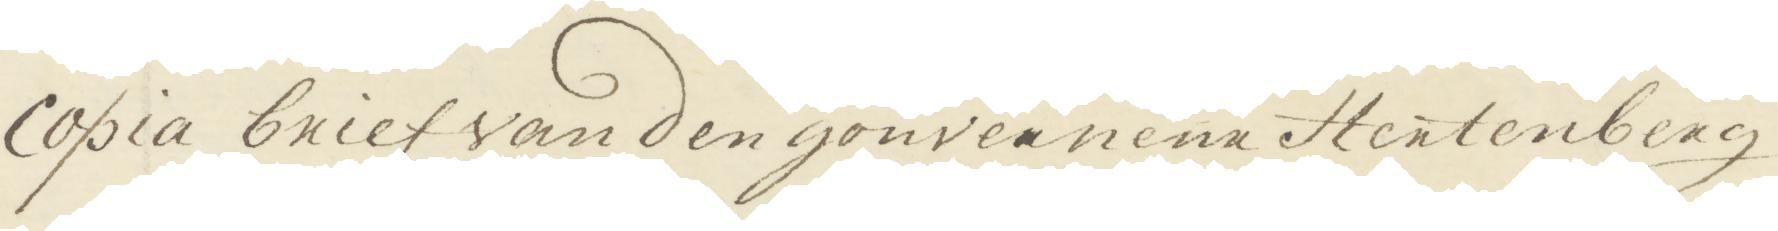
Copia brief van den gouverneur Hertenberg
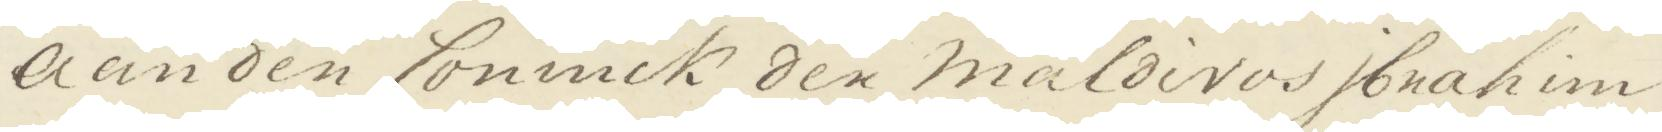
aan den Coninck der maldivos jbrahim
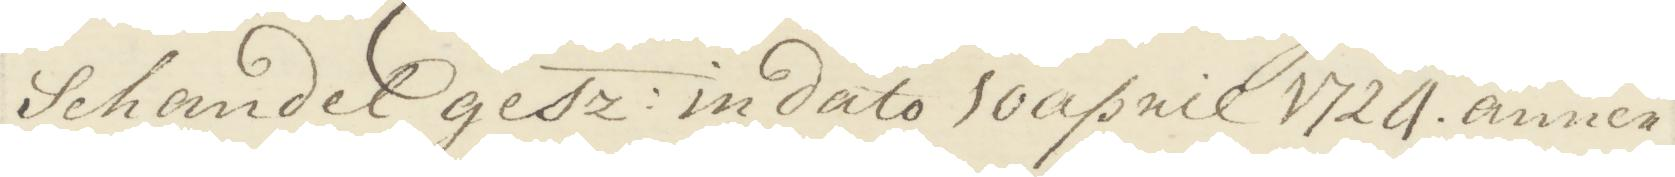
schandel gesz: in dato 10 april 1724. annex
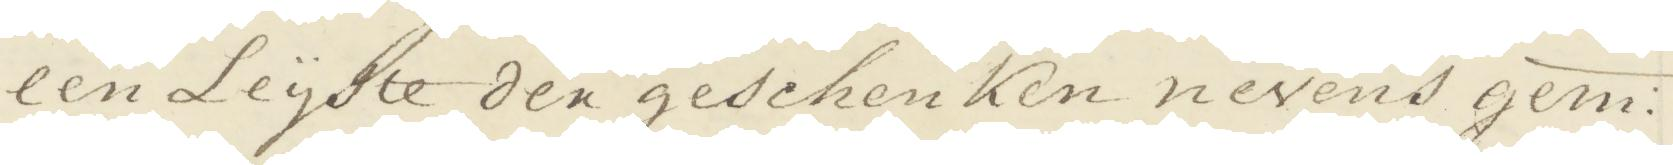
een Leijste der geschenken nevens gem:
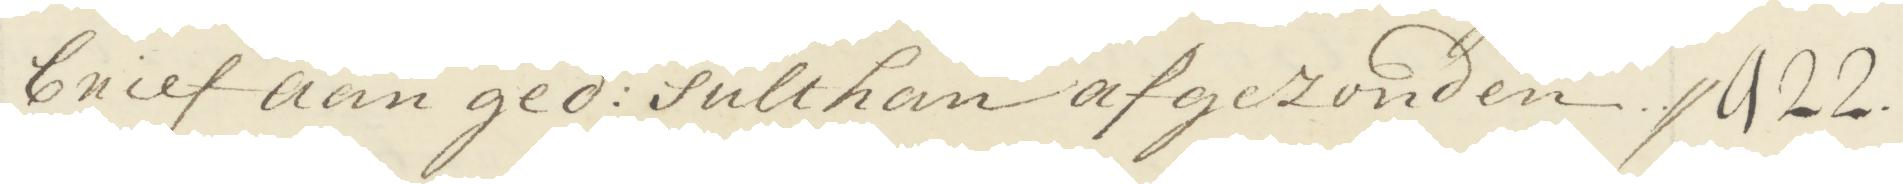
brief aan ged: sulthan afgezonden..„422.
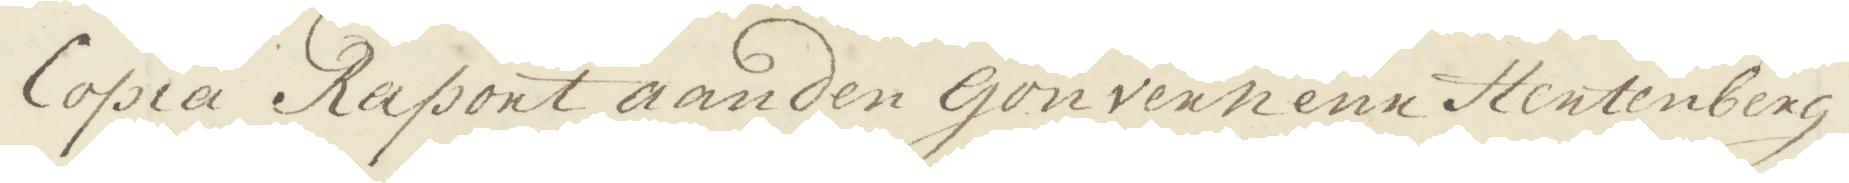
Copia Raport aan den Gouverneur Hertenberg
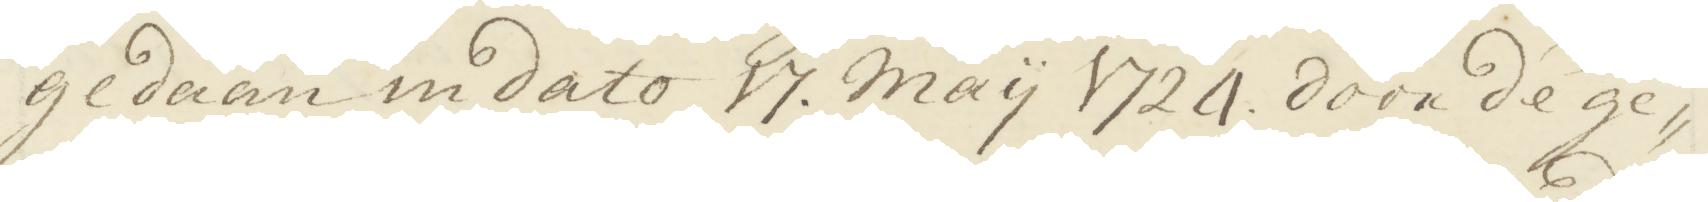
gedaan in dato 17. Maij 1724. door de ge„
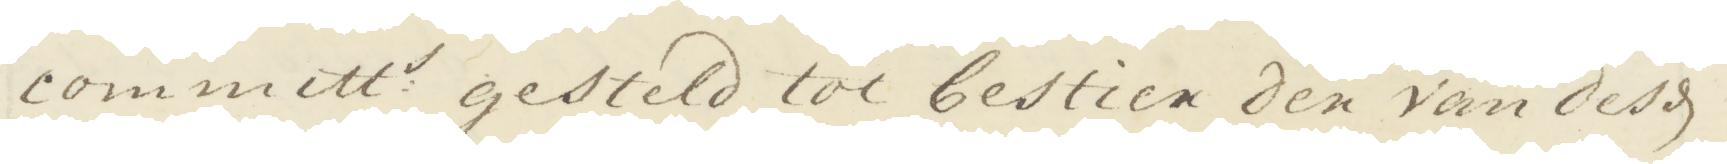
committ:s gesteld tot bestierder van desen
